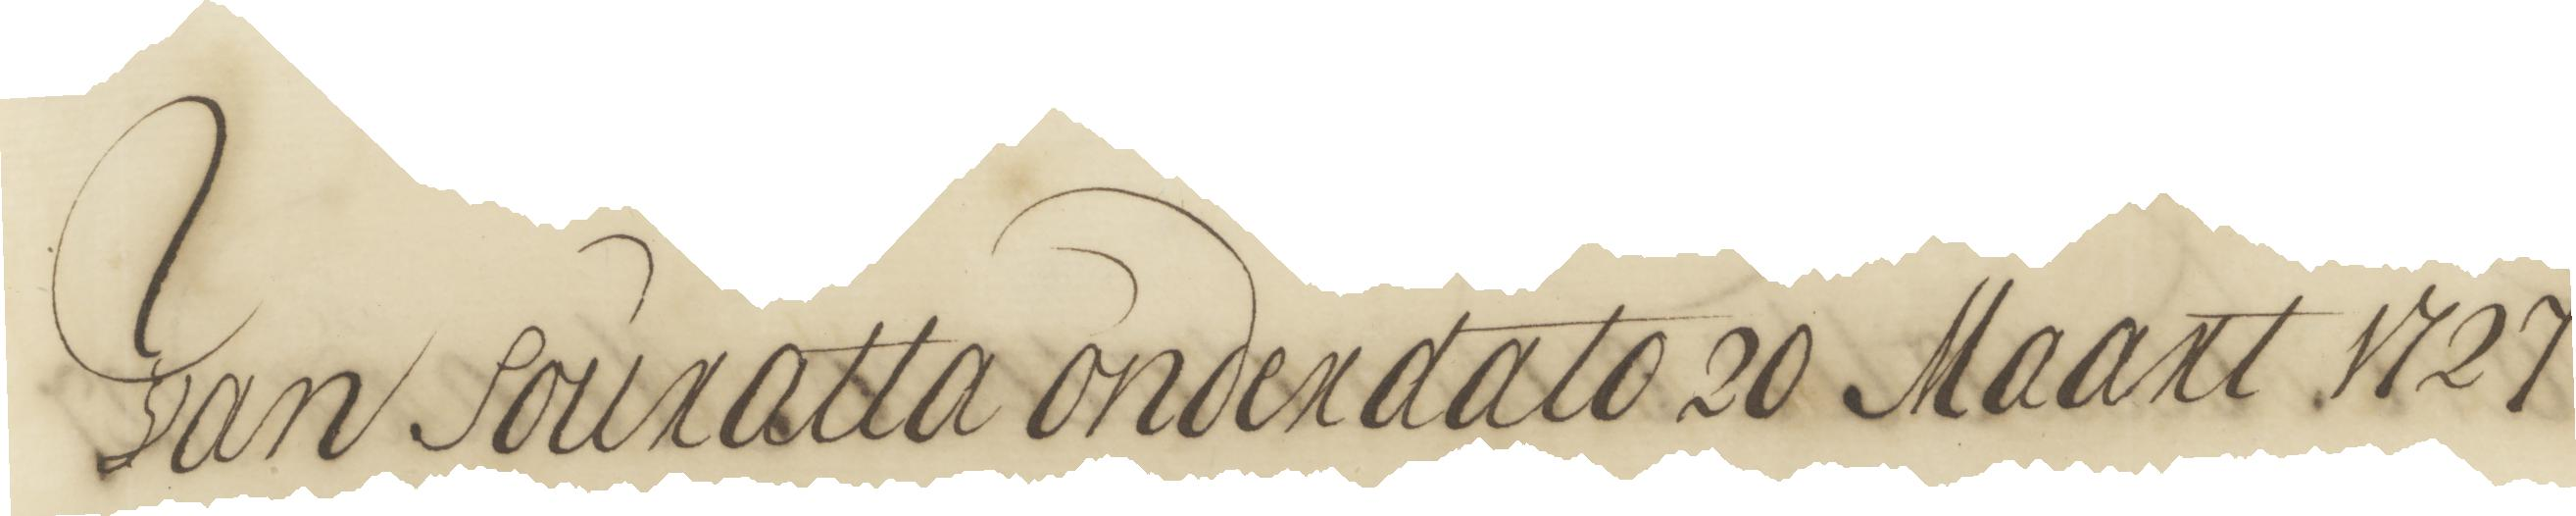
Van Souratta onder dato 20 Maart 1727
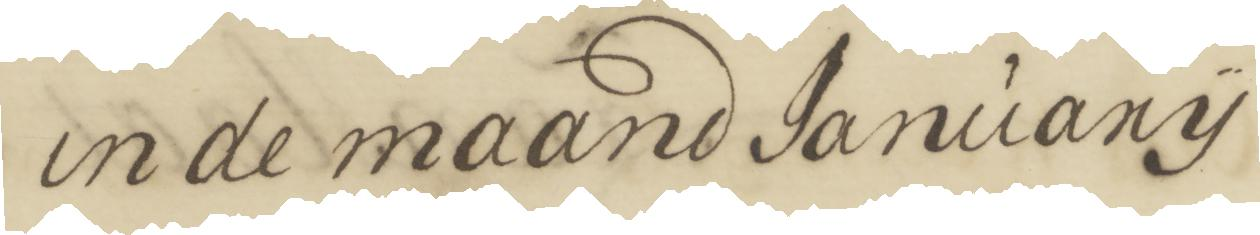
in de maand Ianuarij
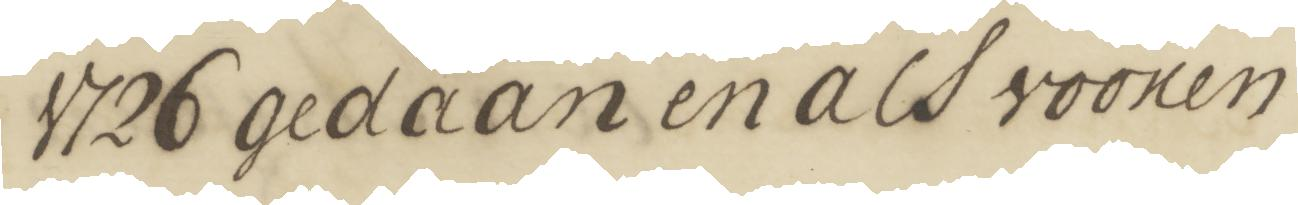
1726 gedaan en als vooren
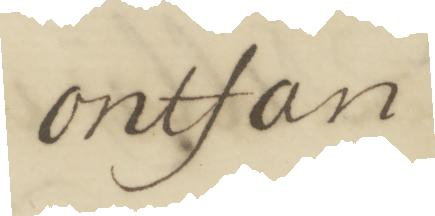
ontfan
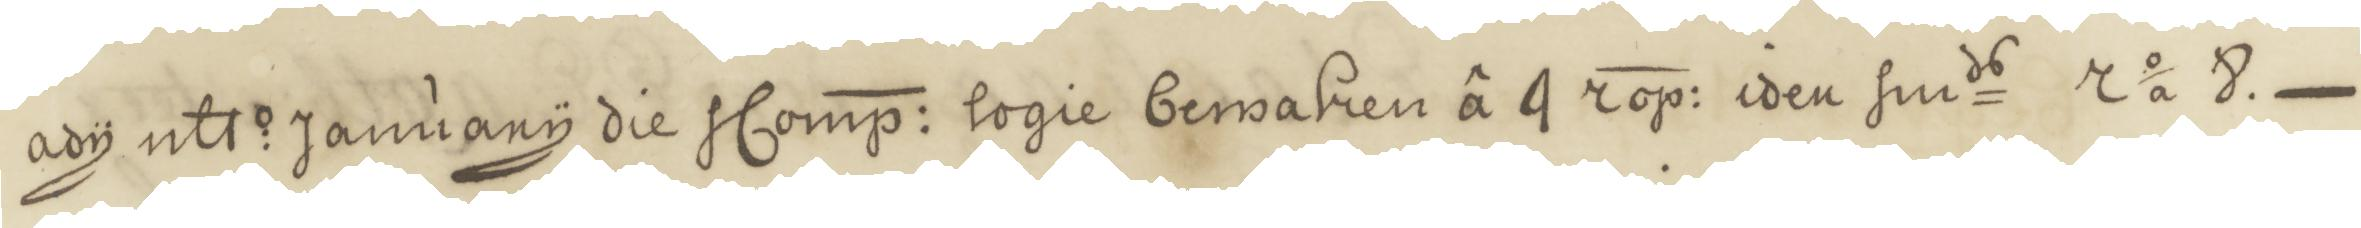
adij ult:o Januarij die sComp: logie bewaken â 4 rop: ider sm=ds r o/a 8. —
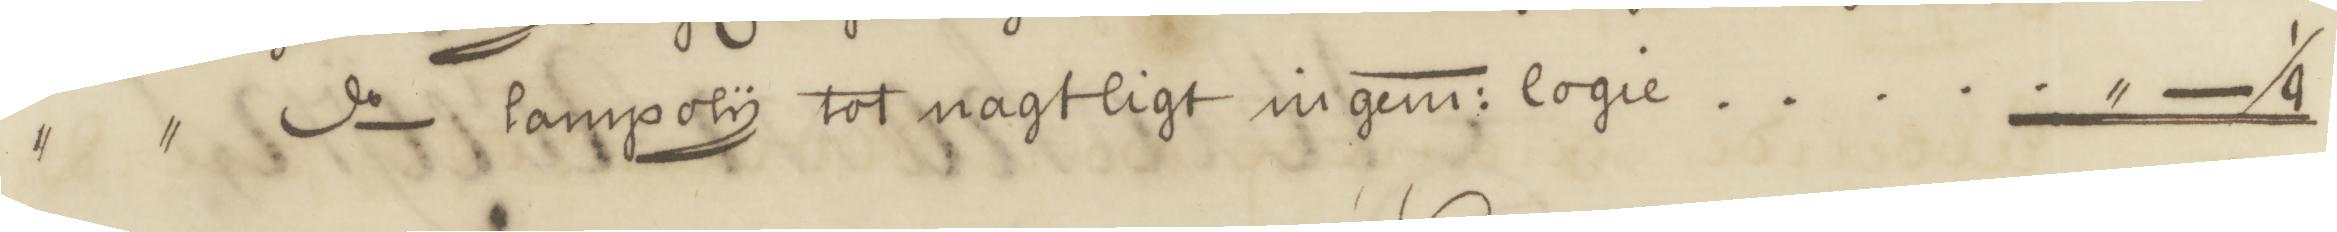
„ „ d-o lampolij tot nagtligt in gem: logie - - - - - „ — ¼
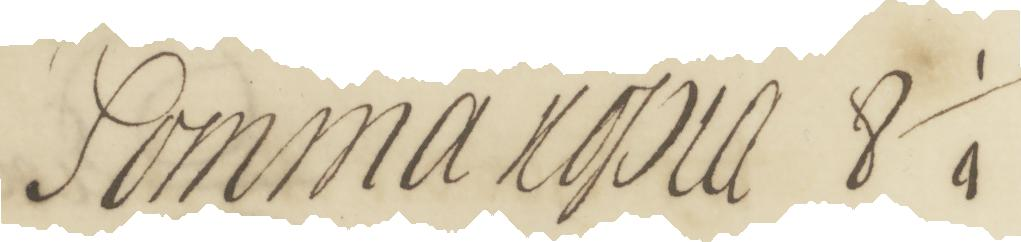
Somma ropia 8¼
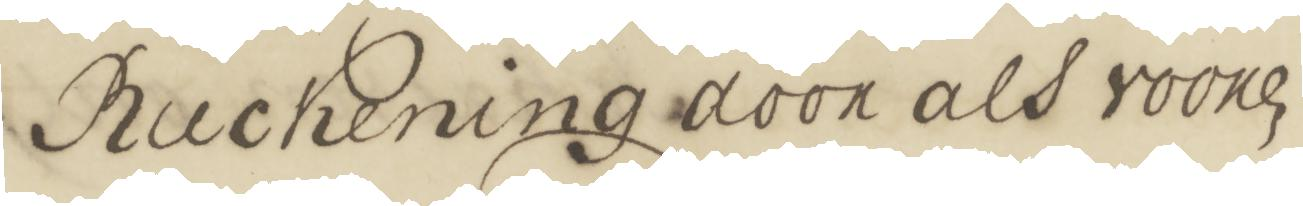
Reeckening door als vooren
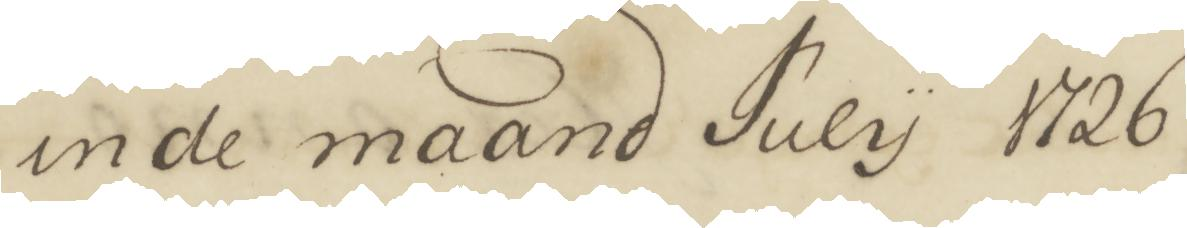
in de maand Iulij 1726
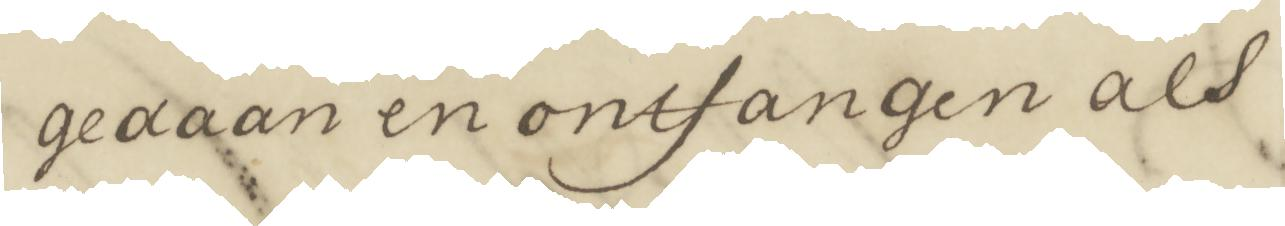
gedaan en ontfangen als
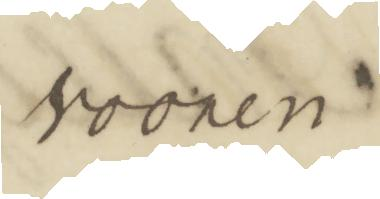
Vooren
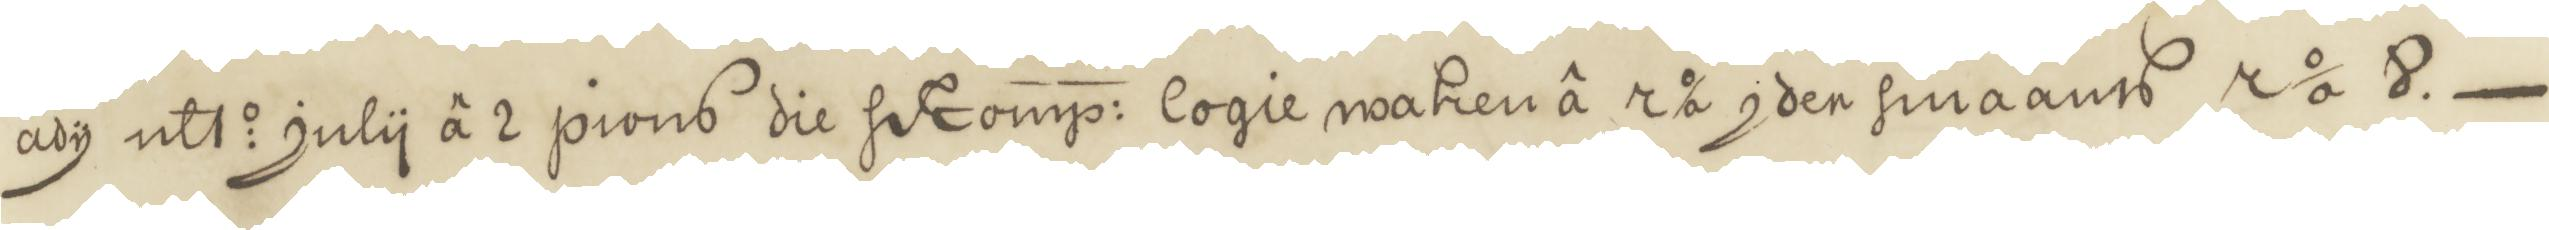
adij ult:o julij â 2 pions die sEcomp: logie waken â r o/a jder smaants r o/a 8. —
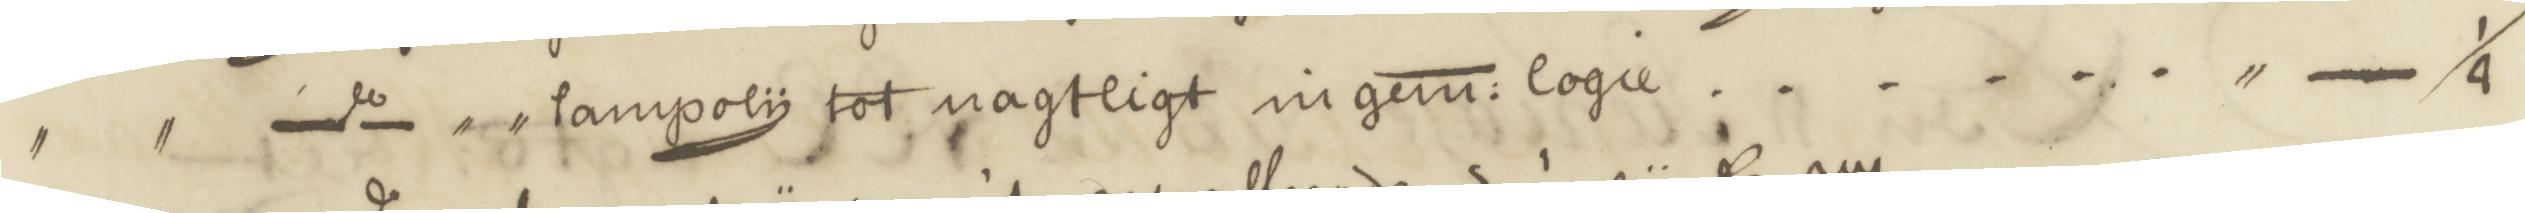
„ „ d-o „ „ lampolij tot nagtligt in gem: logie - - - - - - „ — ¼
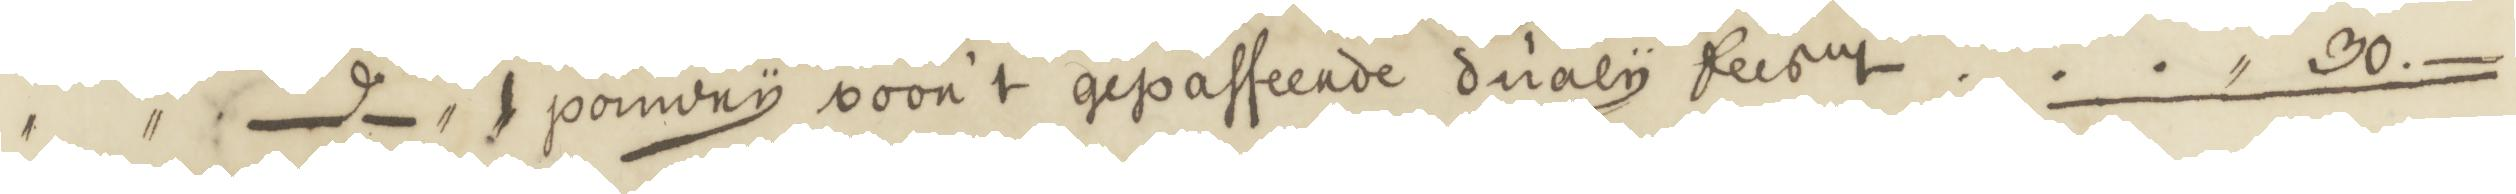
„ „ d-o „ 1 pomerij voor ’t gepasseerde dualij feest - - - „ 30. —
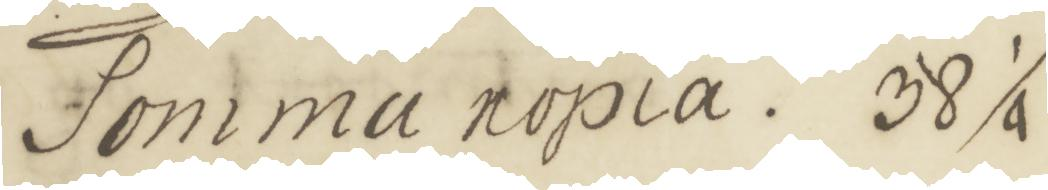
Somma ropia. 38¼
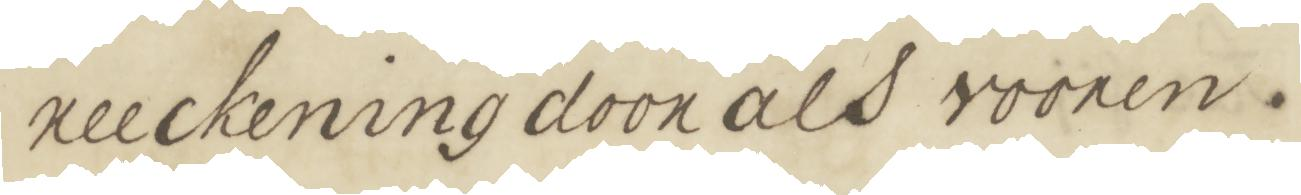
reeckening door als vooren.
